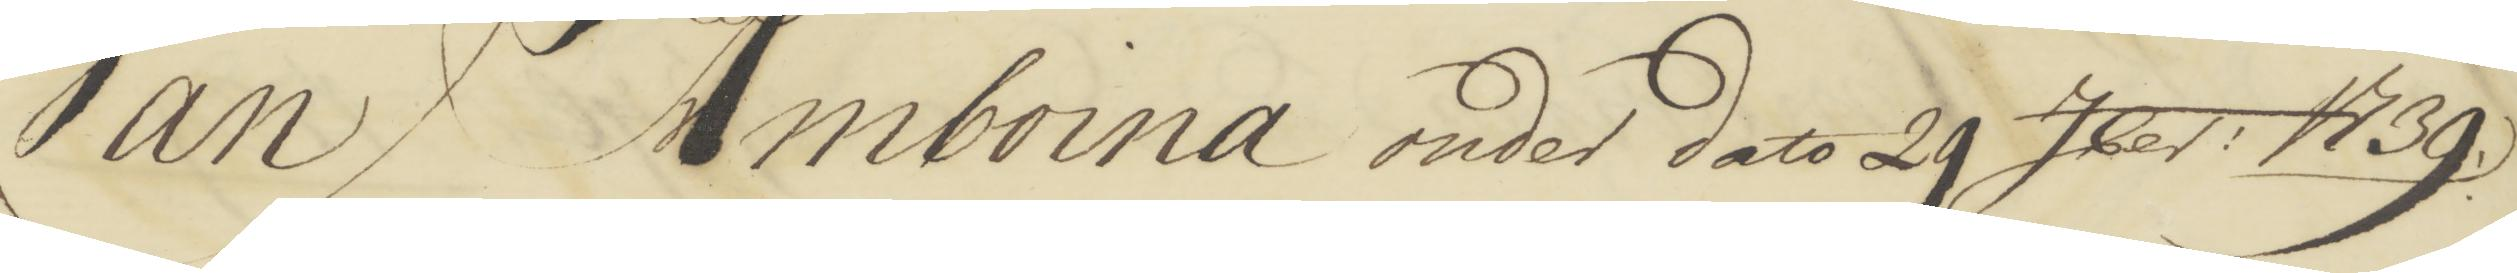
Van Amboina onder dato 29 7ber: 1739:
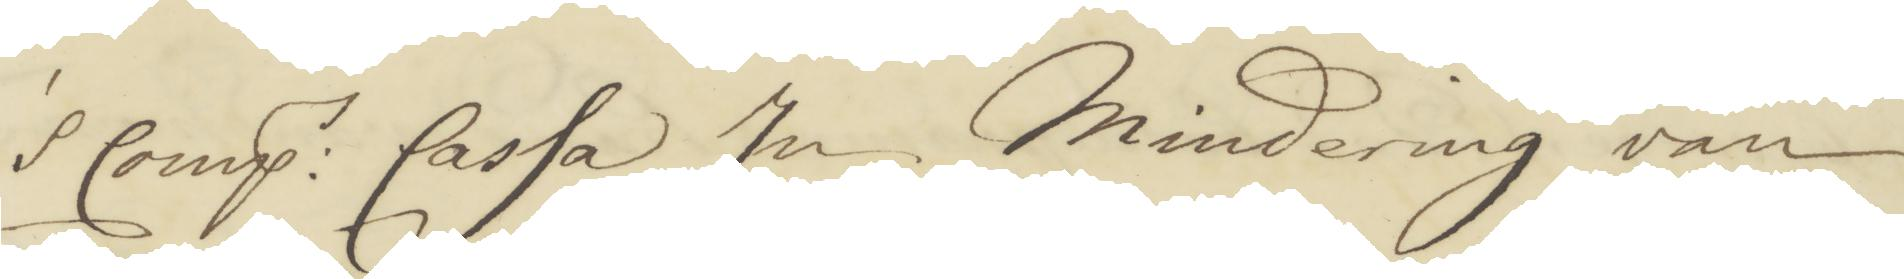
’s Comp:s Cassa In Mindering van
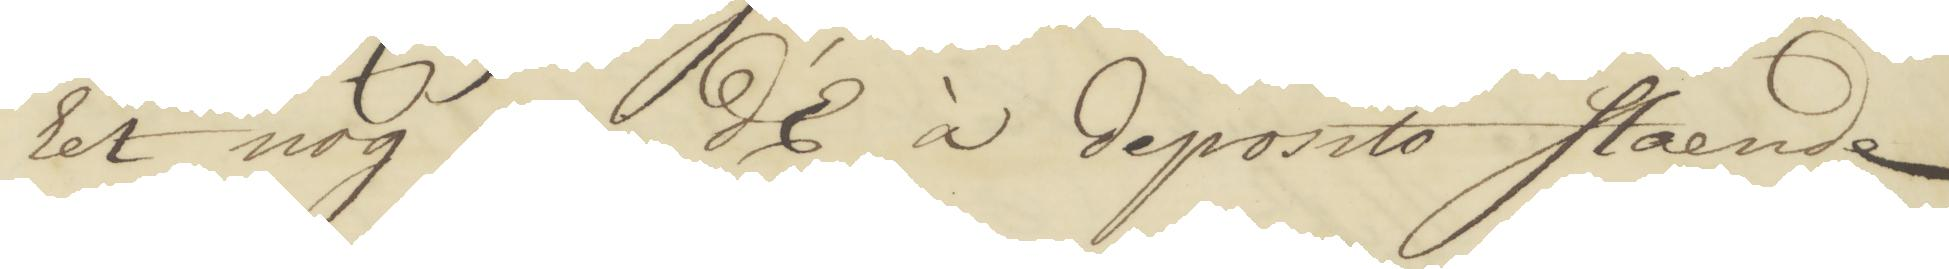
het nog bij d'E à deposito staende
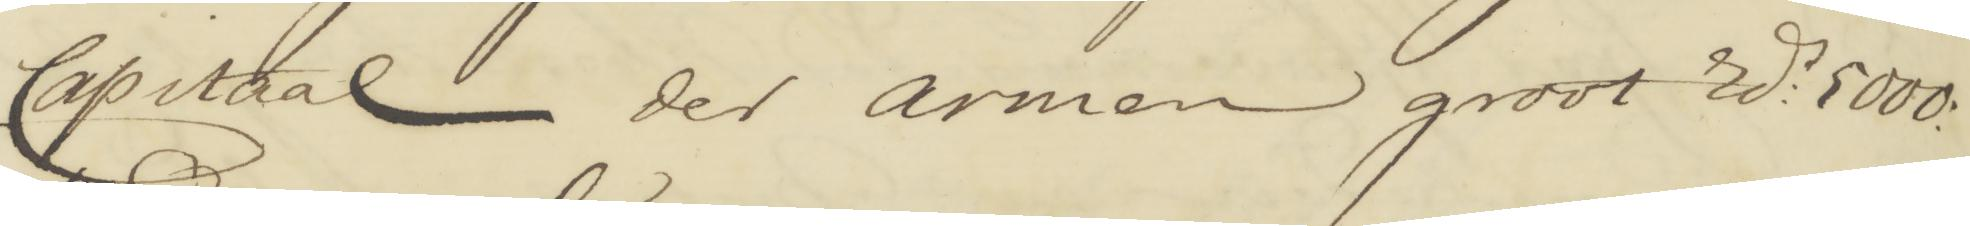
Capitaal der armen groot rd:s 5000:
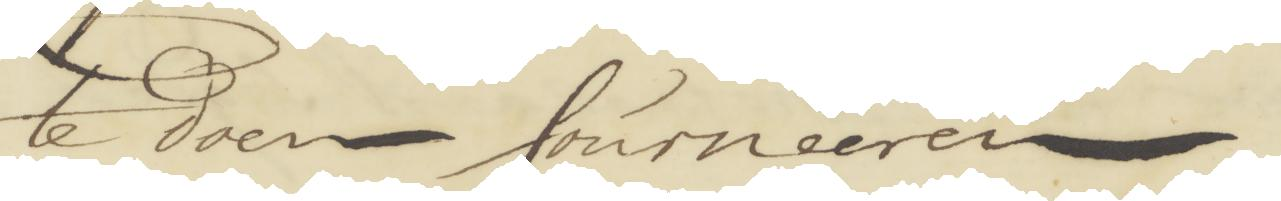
te doen fourneeren.
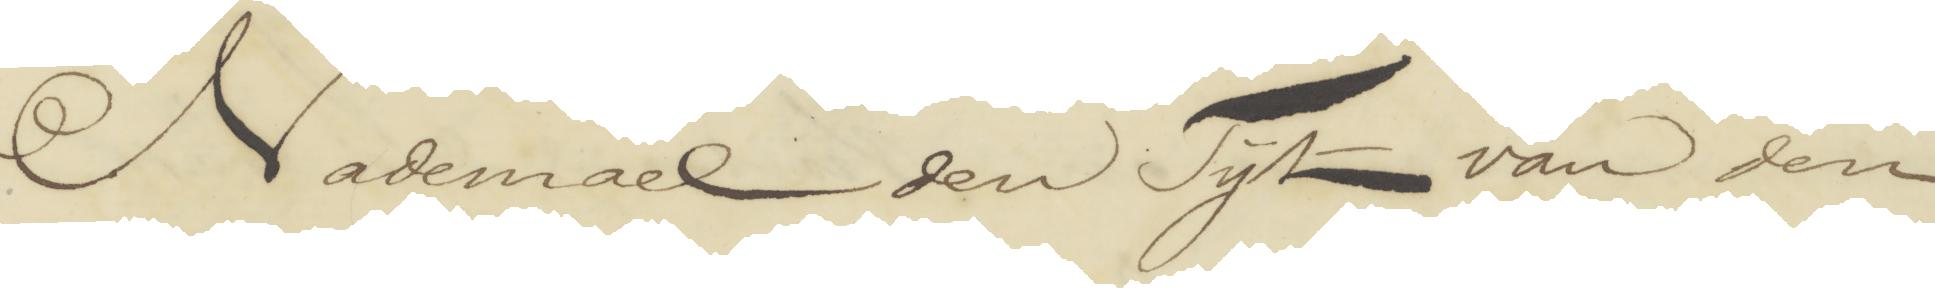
Nademael den Tijt van den
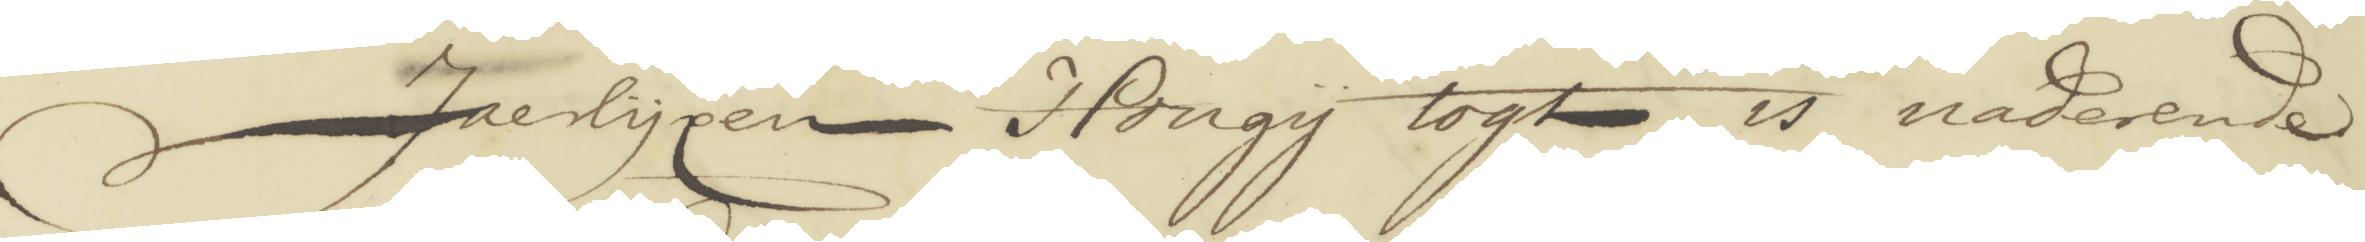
Jaerlijxen Hougij togt is naderende
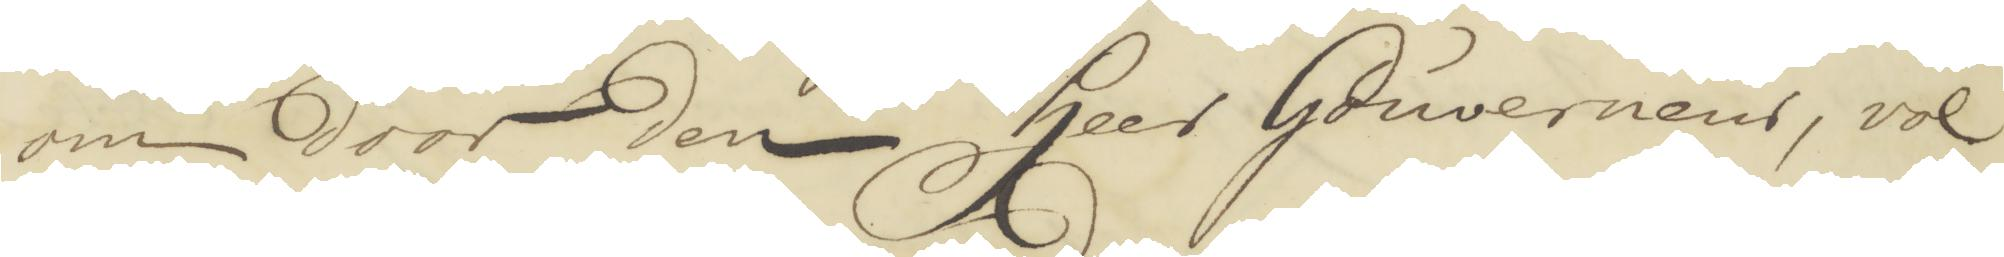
om door den heer Gouverneur, vol
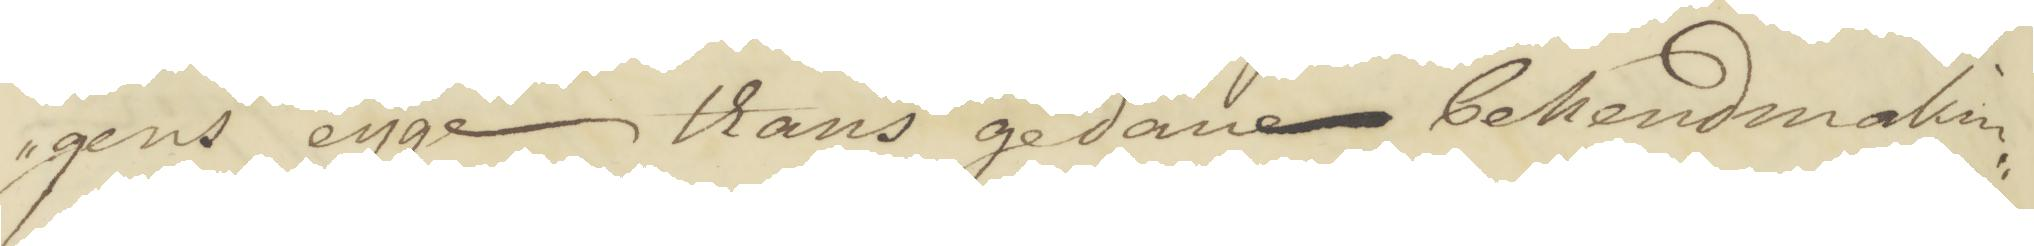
„gens eijge thans gedane bekendmakin„
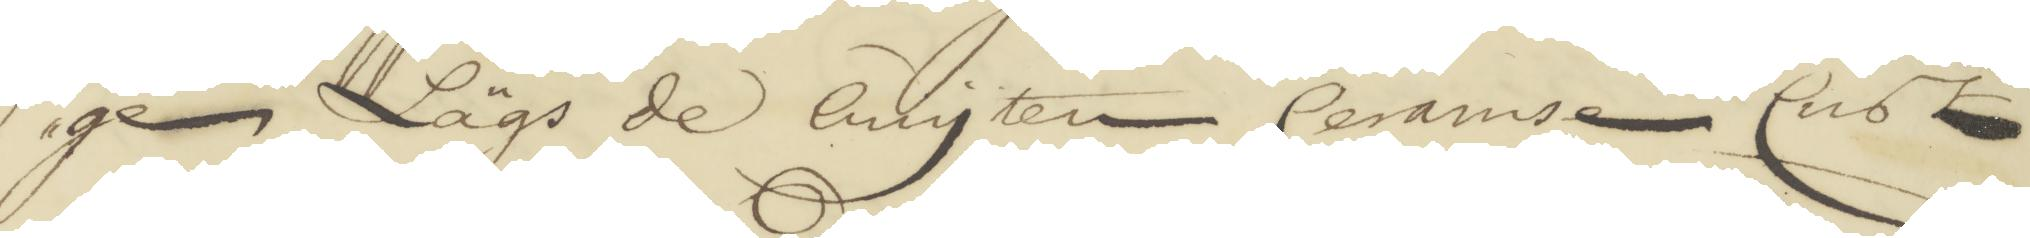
„ge langs de buijten Ceramse Cust
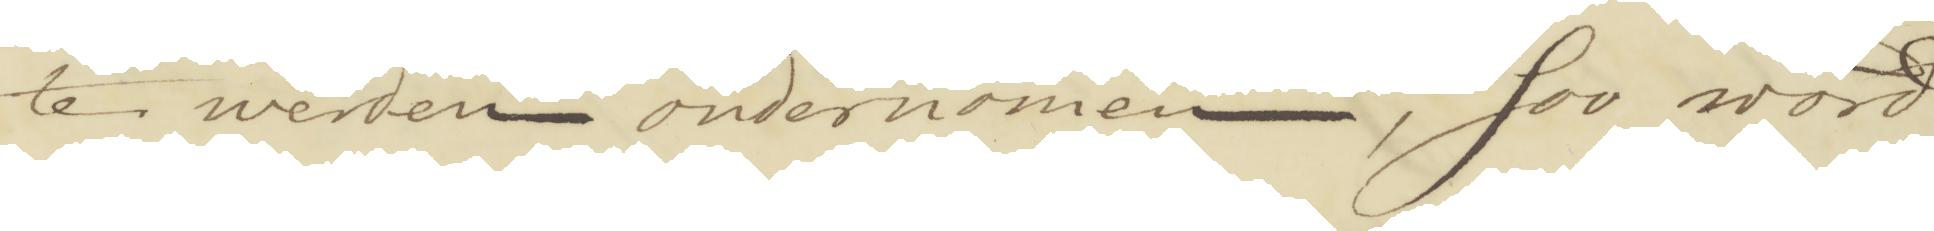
te werden ondernomen, soo word
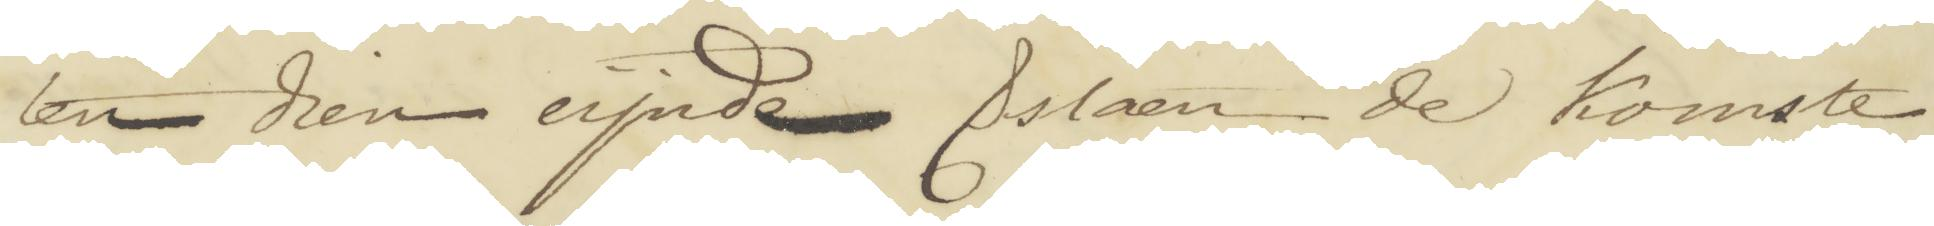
ten dien eijnde verstaen de komste
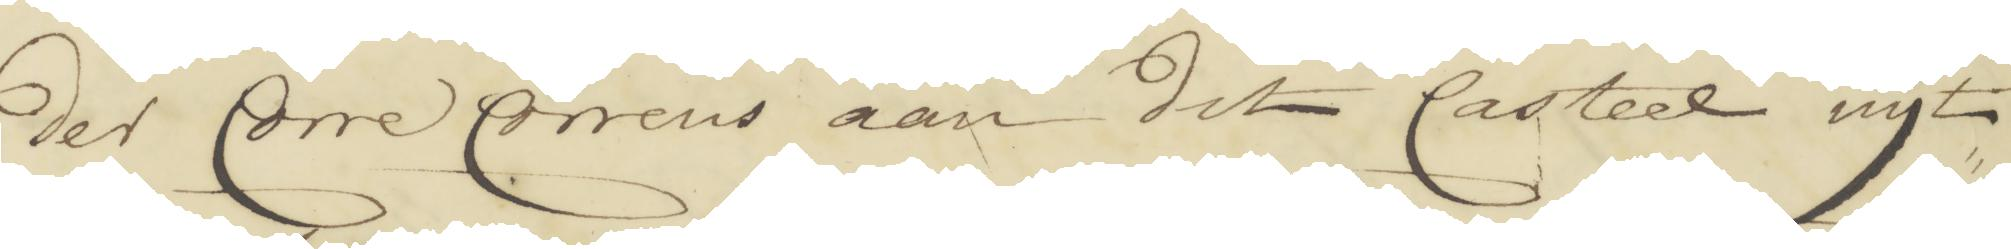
der Corre Correns aan dit Casteel uijt„
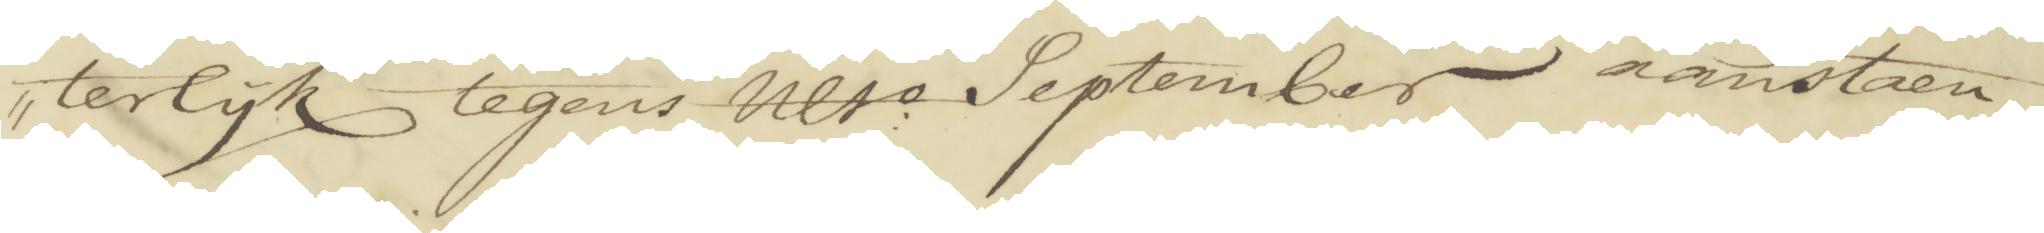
„terlijk tegens ult:o september aanstaen
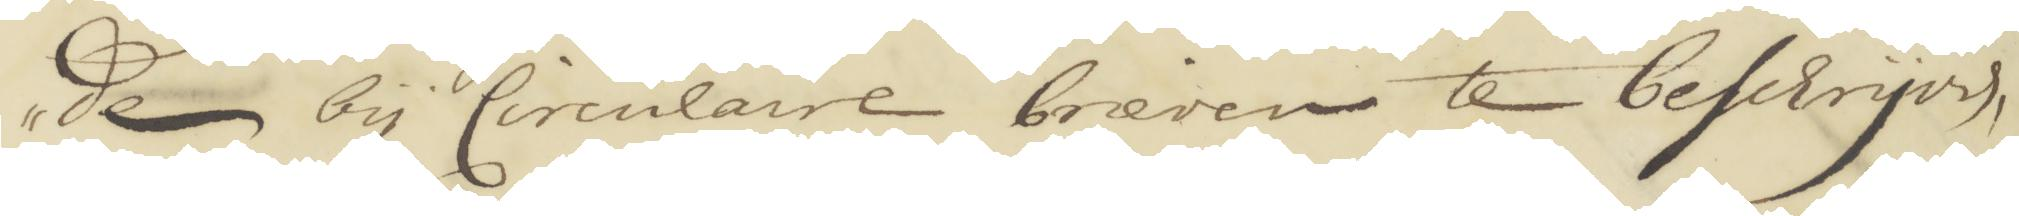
„de bij Circulaire brieven te beschrijven,
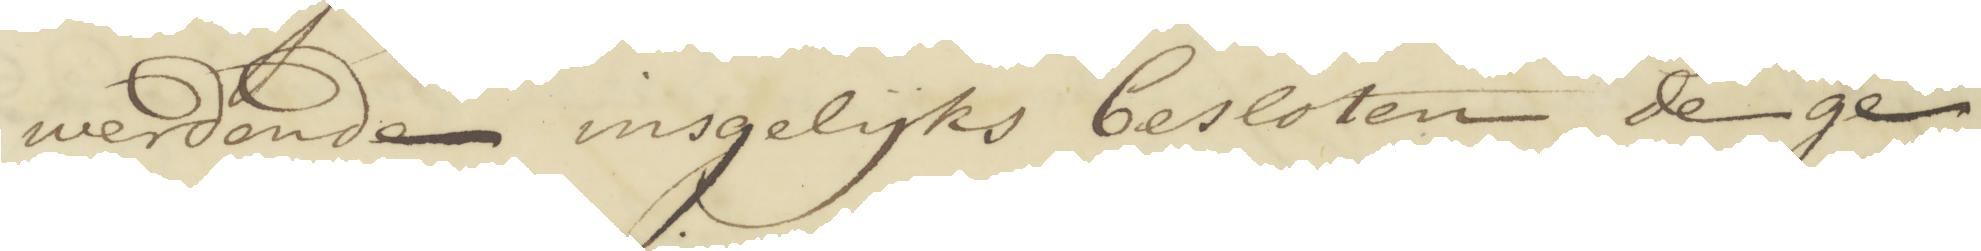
werdende insgelijks besloten de ge
